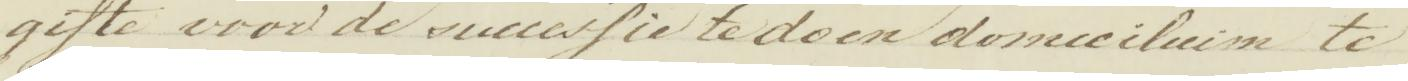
gifte voor de successie te doen domiciluim te
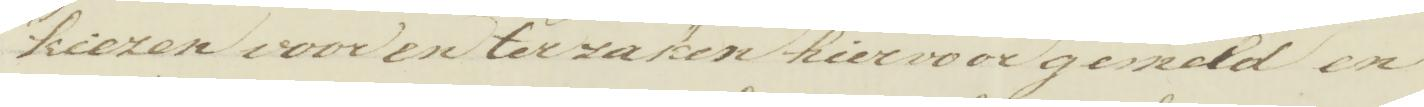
kiezen voor en ter zaken hiervoor gemeld en
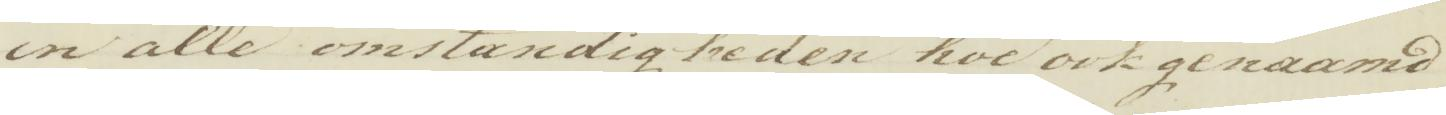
in alle omstandigheden hoe ook genaamd
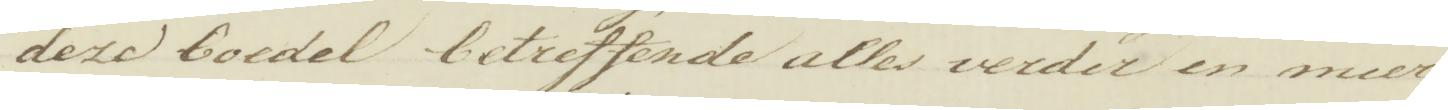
deze boedel betreffende alles verder en meer
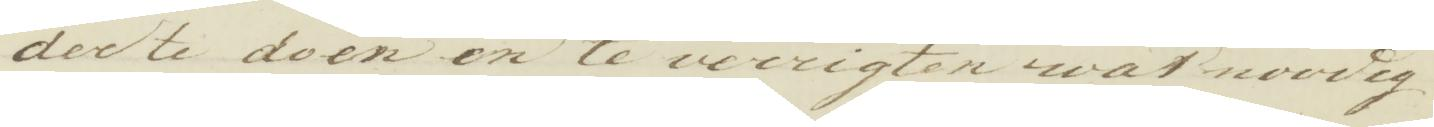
der te doen en te verrigten wat noodig
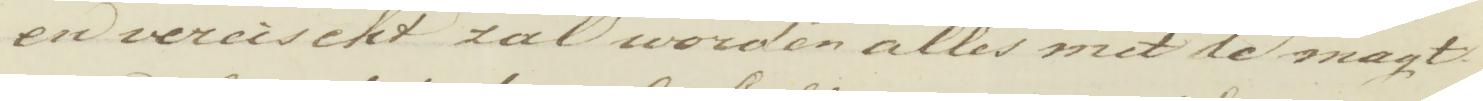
en vereischt zal worden alles met de magt
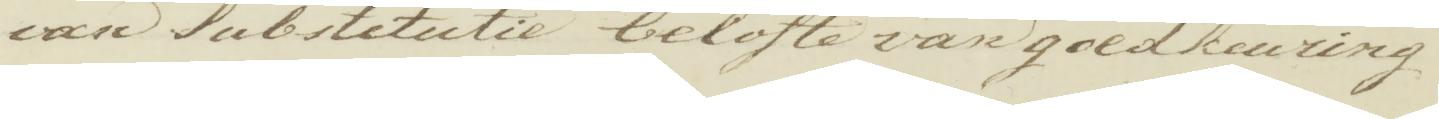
van substitutie belofte van goedkeuring
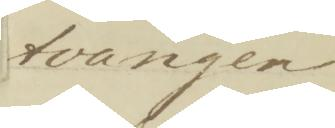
tvangen
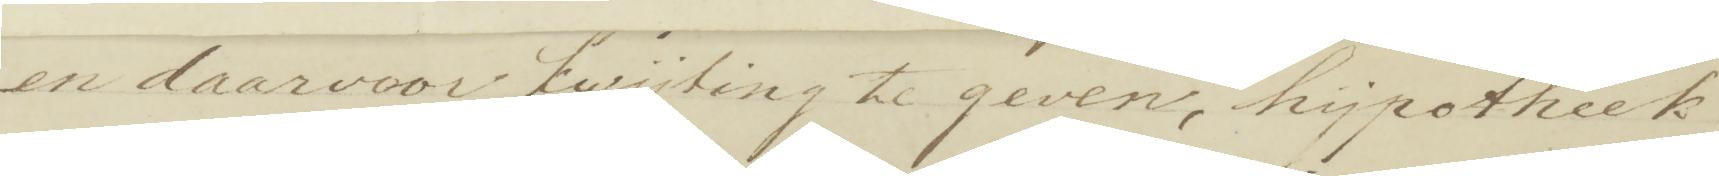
en daarvoor kwijting te geven, hijpotheek
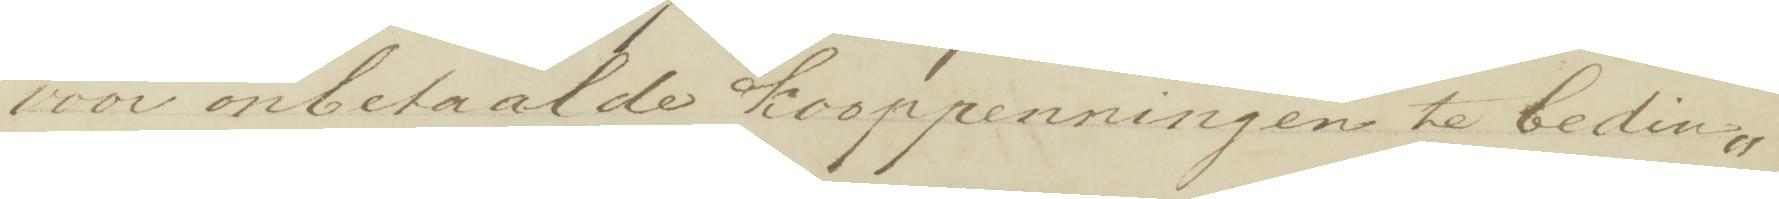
voor onbetaalde kooppenningen te bedin„
